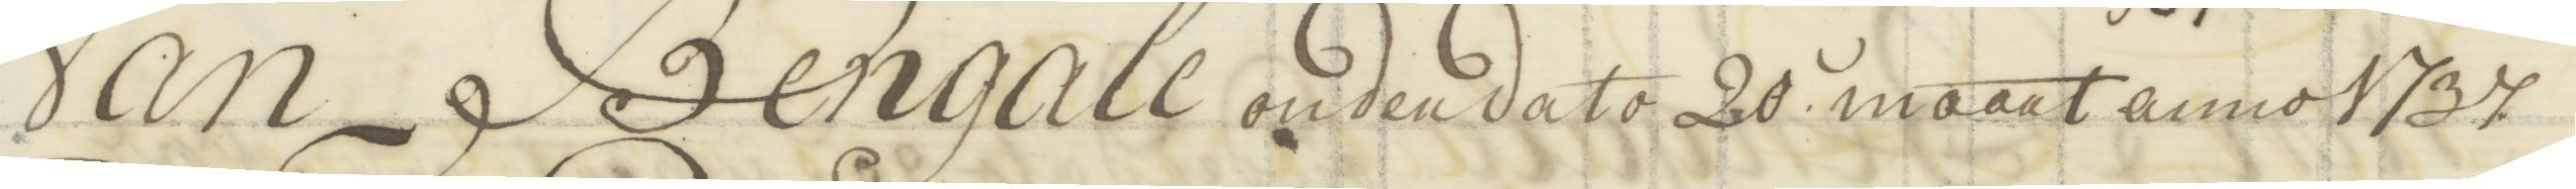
Van Bengale onder dato 20:' maart anno 1737.
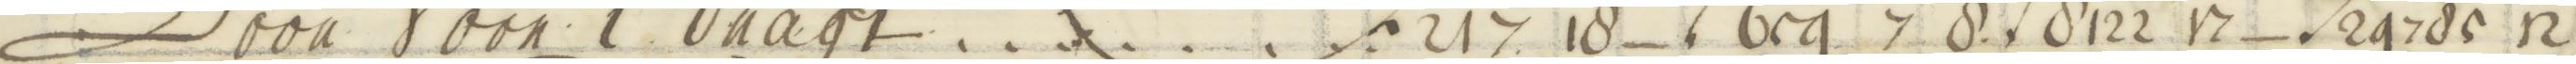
Door Voor ’t dragt . . . . . . ƒ. 217. 18 —ƒ 654. 7. 8. ƒ8122: 17 — ƒ24785 12
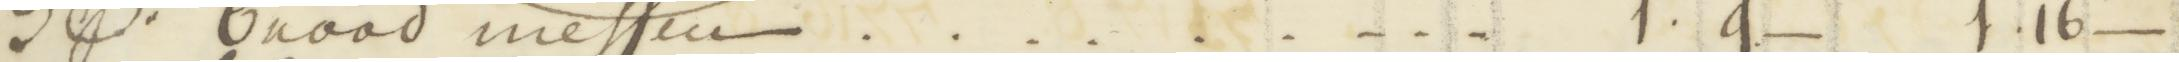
3 p.s brood messen . . . . . . . . . 1.4.— 1.16—
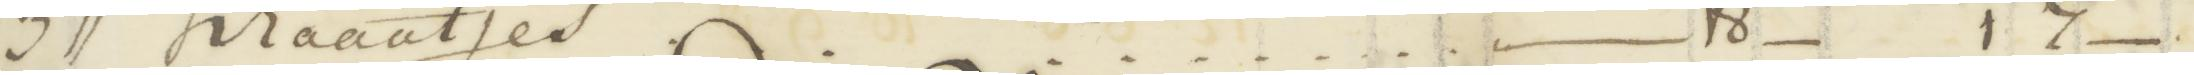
3 „ schaartjes . . . . . . . . . . — 18— 1 7—.
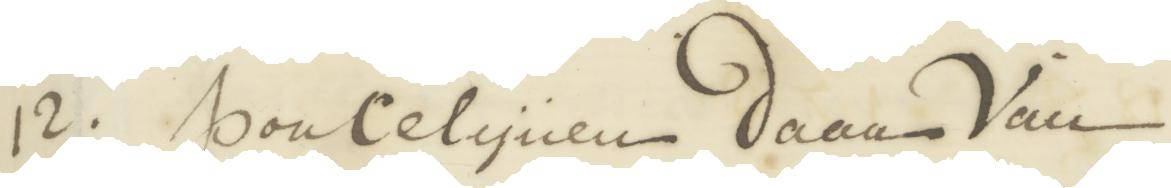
12. porcelijnen daar van
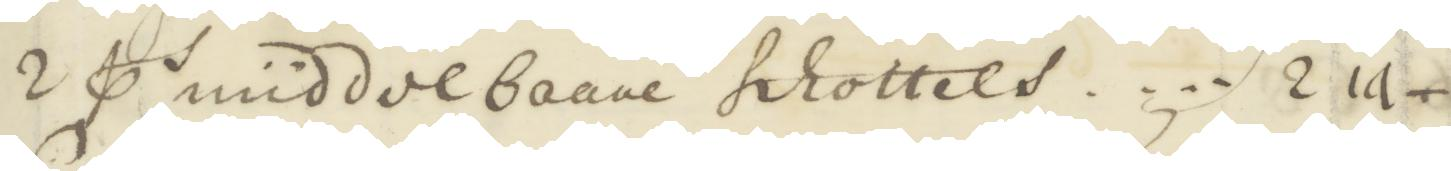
2 ps middelbaare schottels . . . ƒ 2 14 —
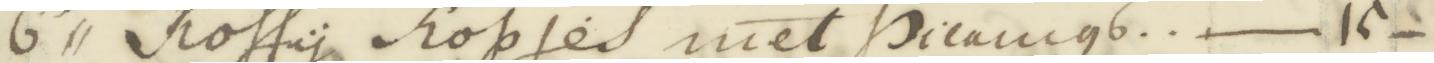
6 „ Koffij kopjes met Pierings . . — 15 —
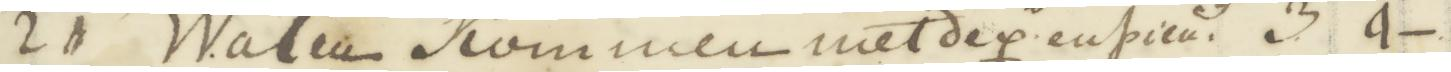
2 „ Water kommen met dex.s en pier.gs 3 4—.
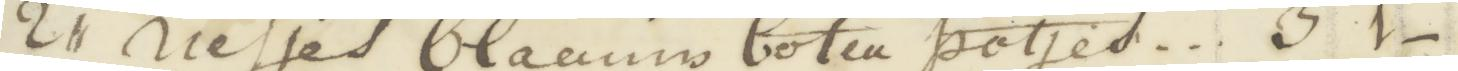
2 „ nesjes blaauw boten potjes . . . 3 1—
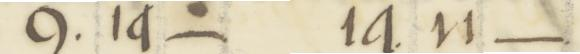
9.14— 14.11.—
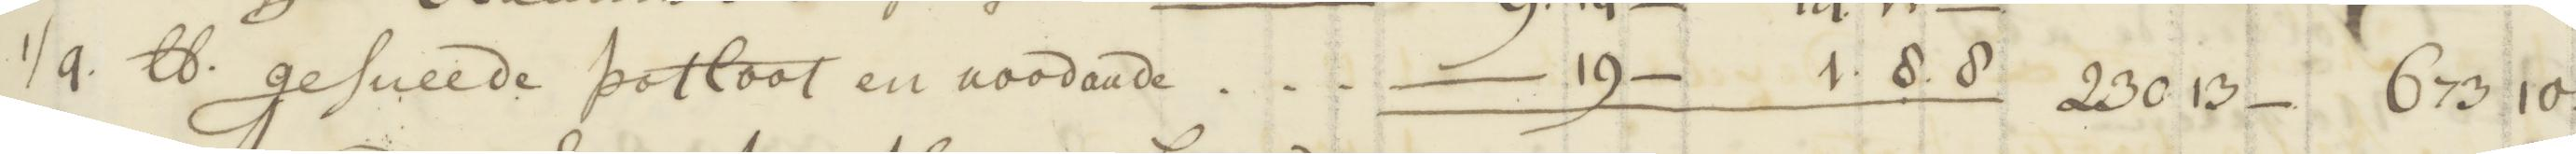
¼. lb. gesneede potloot en roodarde . . . — 19 — 1. 8. 8 230. 13 —. 673 10
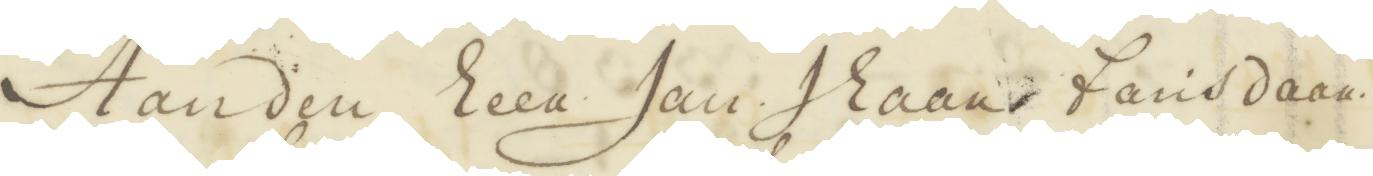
Aan den heer Jan Jhaar faus daar
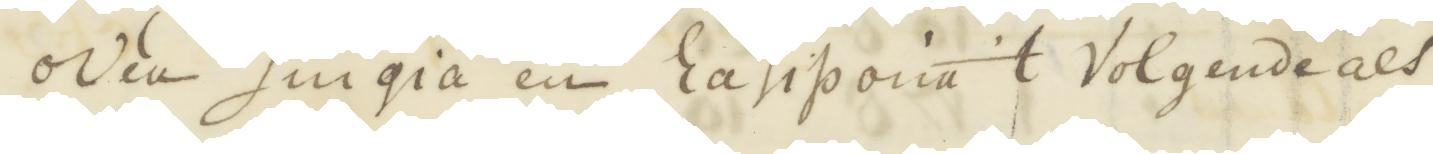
over singia en hasipour ’t volgende als
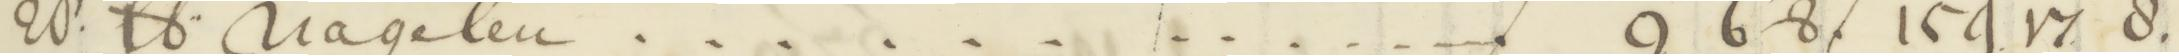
28. lb nagelen . . . . . . . . . . . . . ƒ 9 68 ƒ154.17.8.
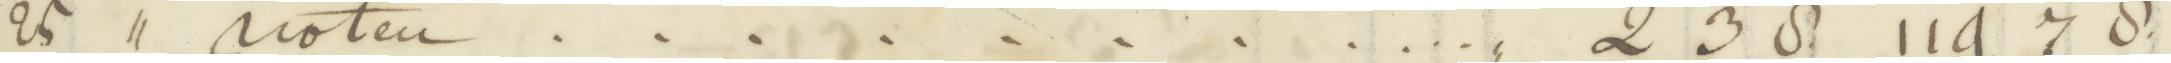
25 „ noten . . . . . . . . . . . „ 238 114 7 8.
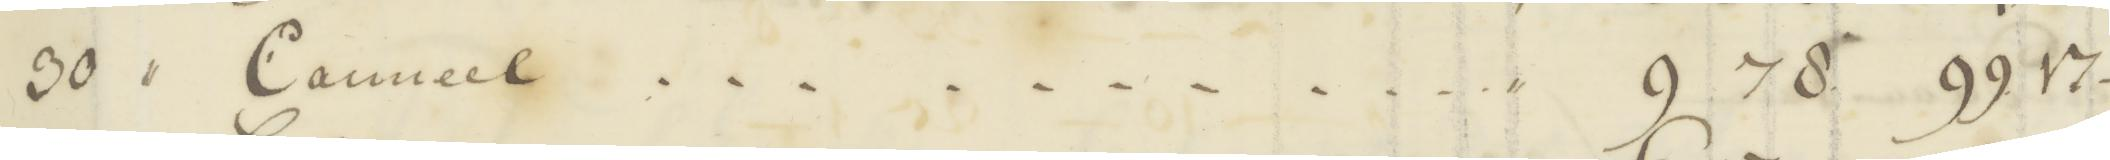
30 „ Canneel . . . . . . . . . . . „ 9 78 99. 17
